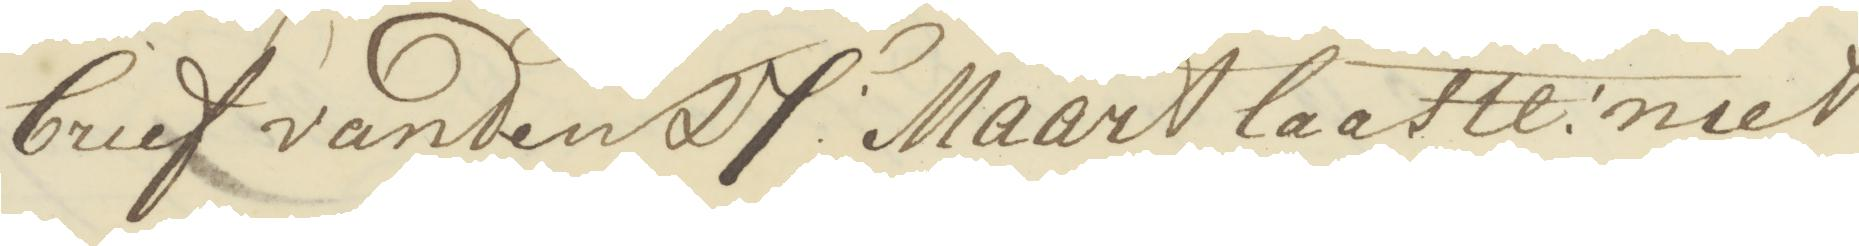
brief van den 27:' Maart laastl: niet
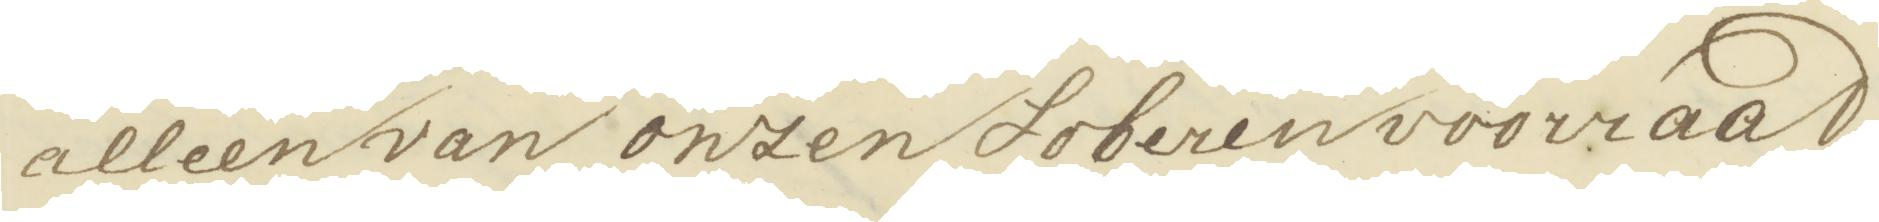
alleen van onzen Soberen voorraad
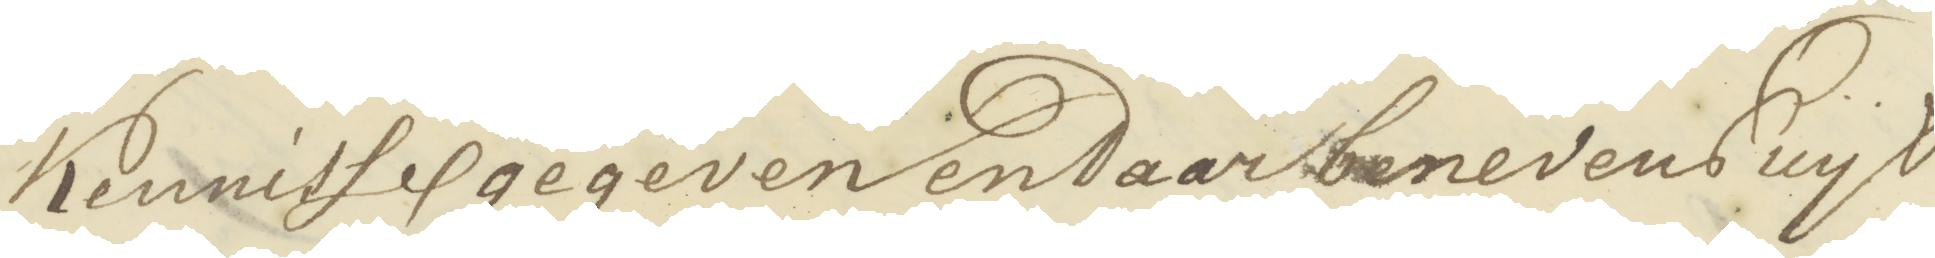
kennisses gegeven en daar benevens uijt
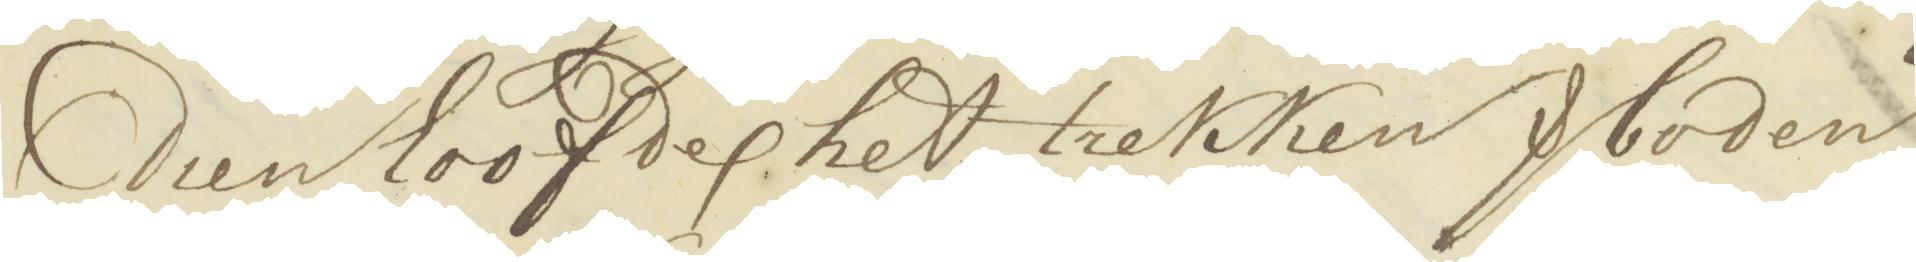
dien hoofde het trekken verboden
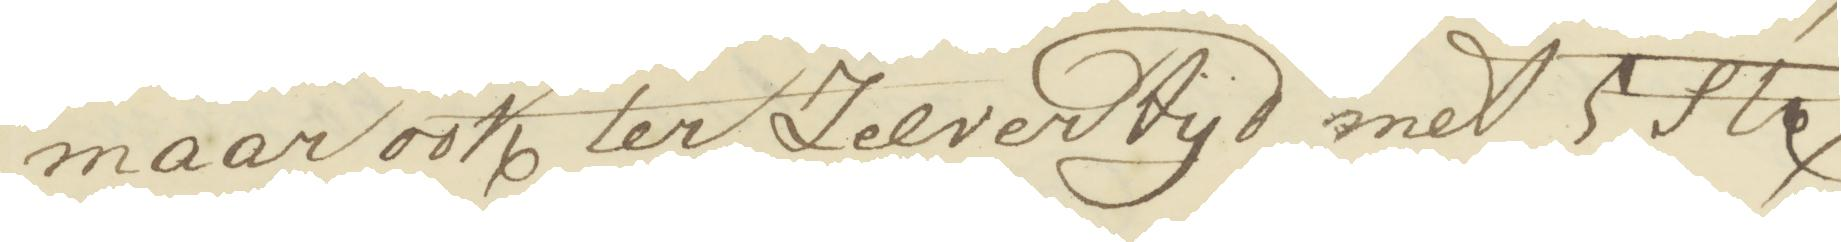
maar ook ter Zelver tijd met 5 stx
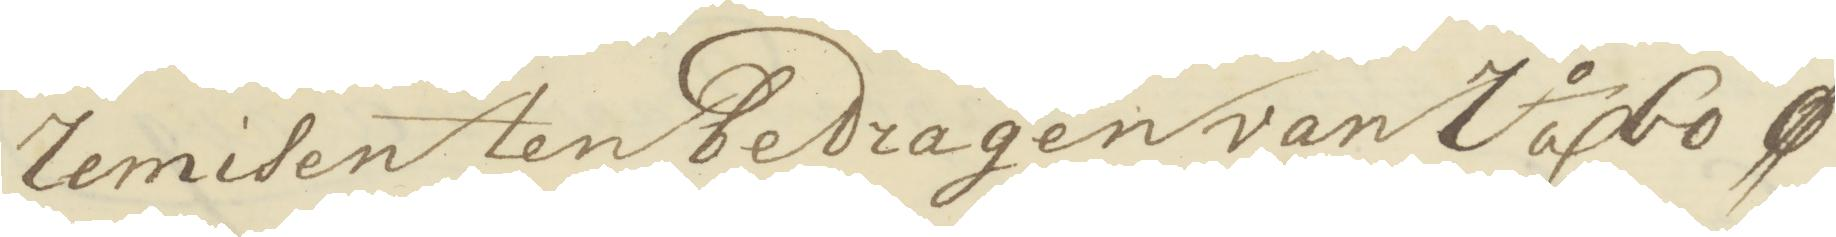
Remisen ten bedragen van R o/a 60 Ø
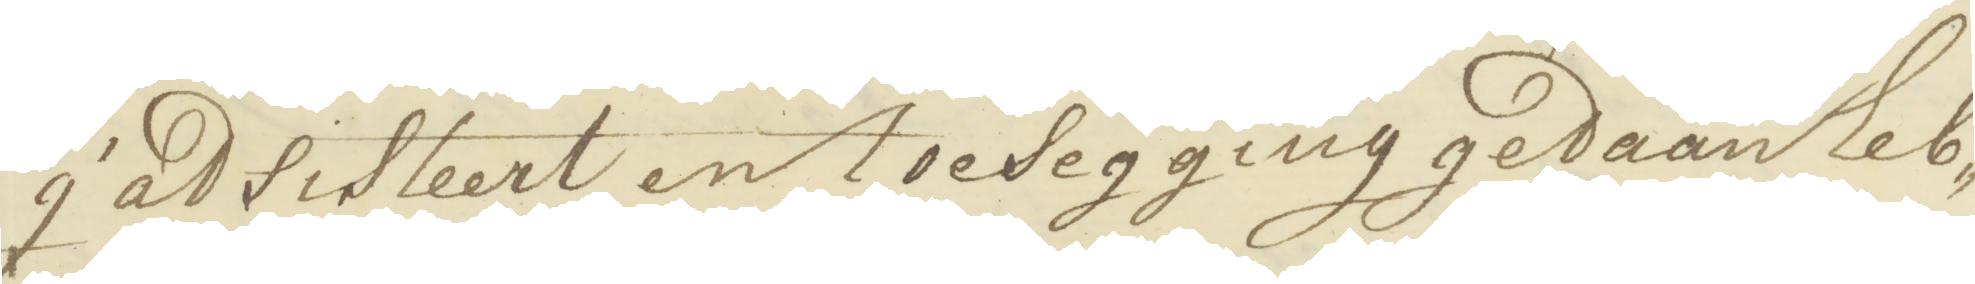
g' adsisteert en toesegging gedaan heb„
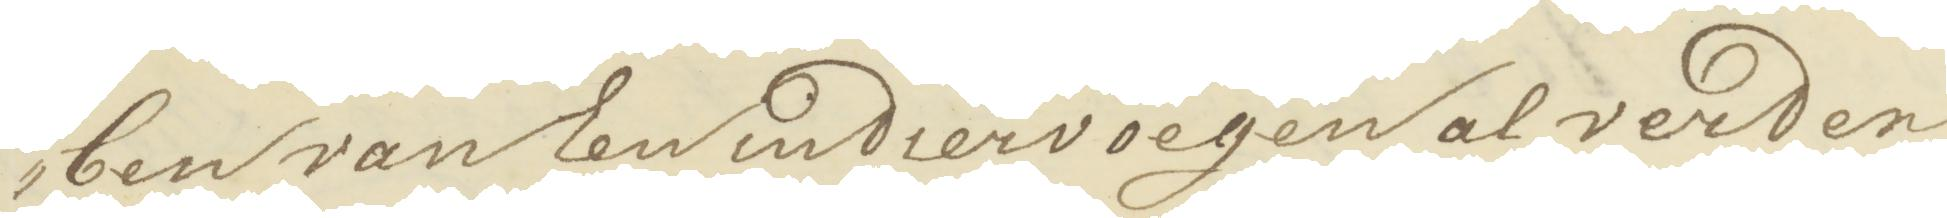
„ben van hen indier voegen al verder
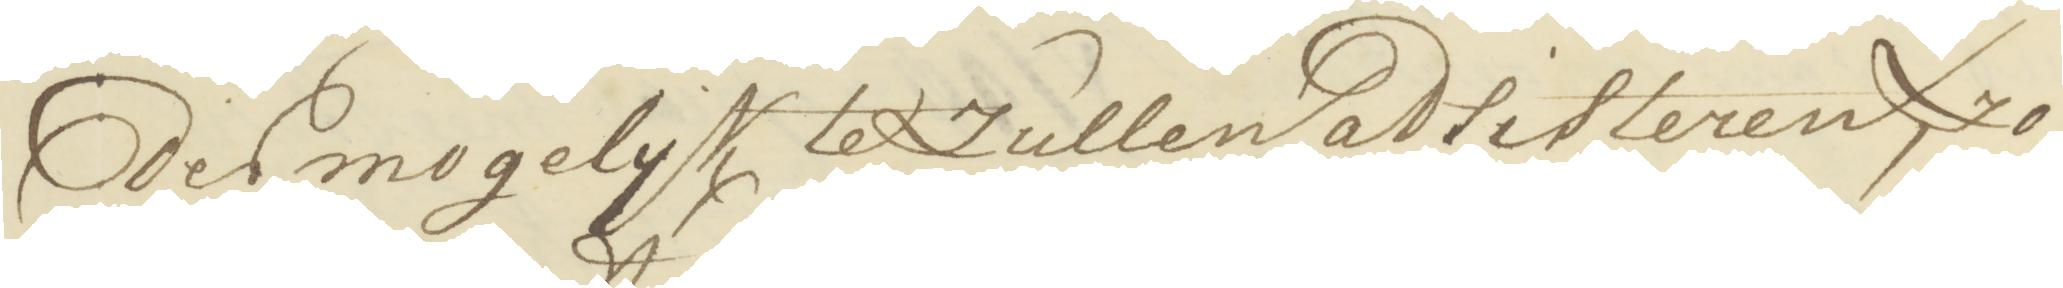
des mogelijk te zullen adsisteren, zo
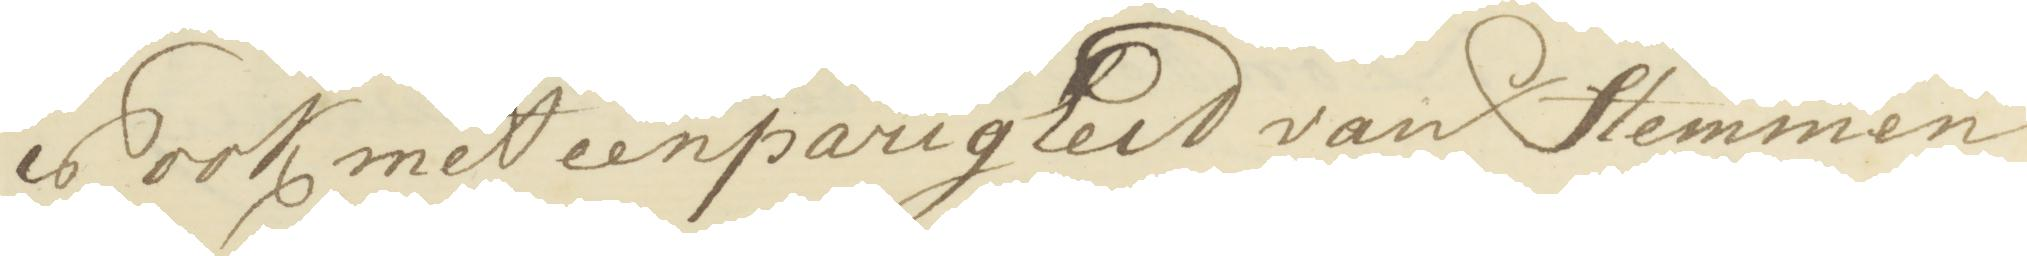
is ook met eenparigheid van Stemmen
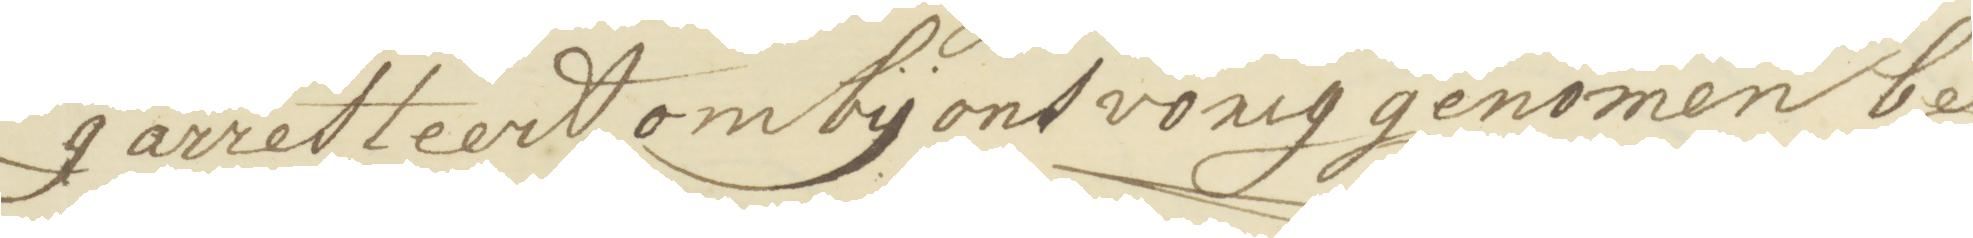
g'arresteert om bij ons vorig genomen be
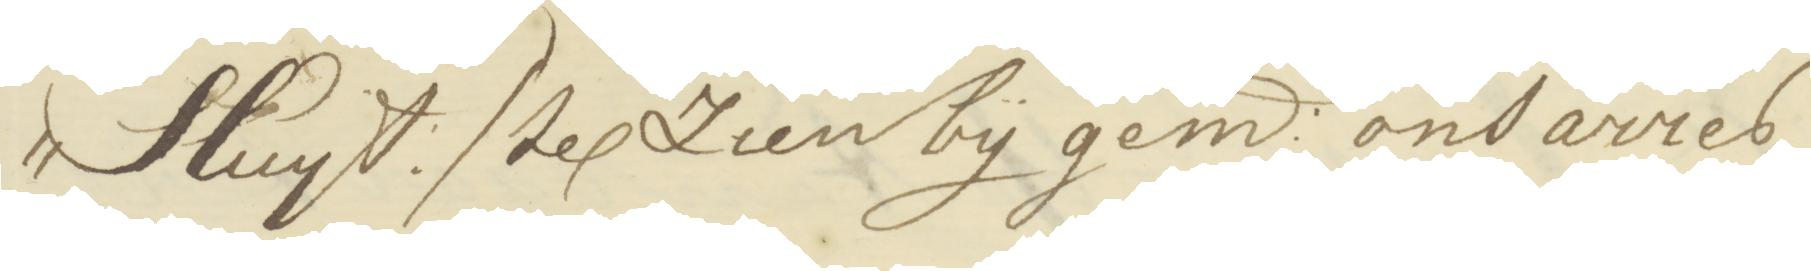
„ Sluijt:/ te Zien bij gem: ons arrest
